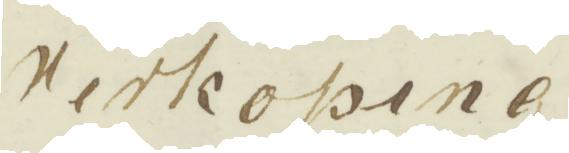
Verkoping
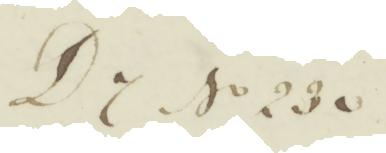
Dr N:o 230
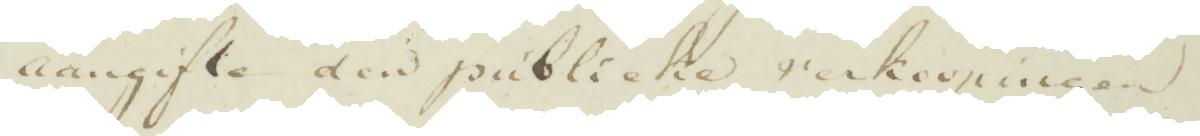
aangifte der publieke verkoopingen
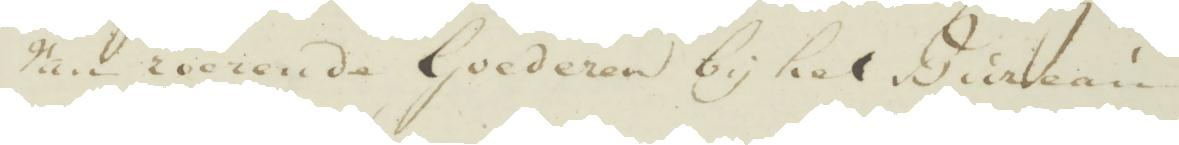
Van roerende Goederen bij het Bureau
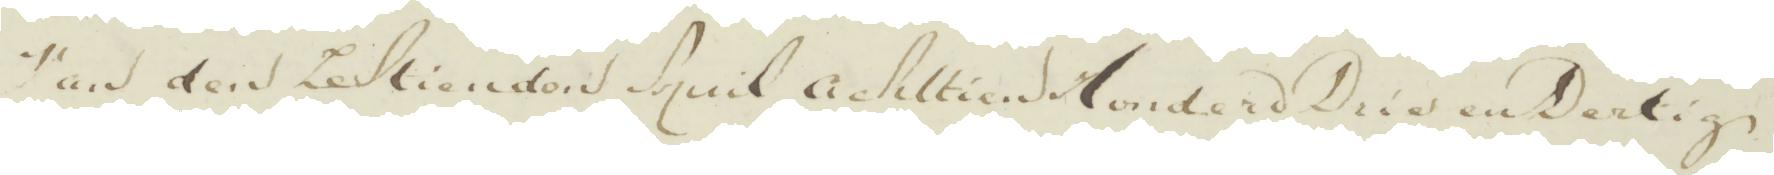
Van den Zestienden April achttien Honderd Drie en Dertig
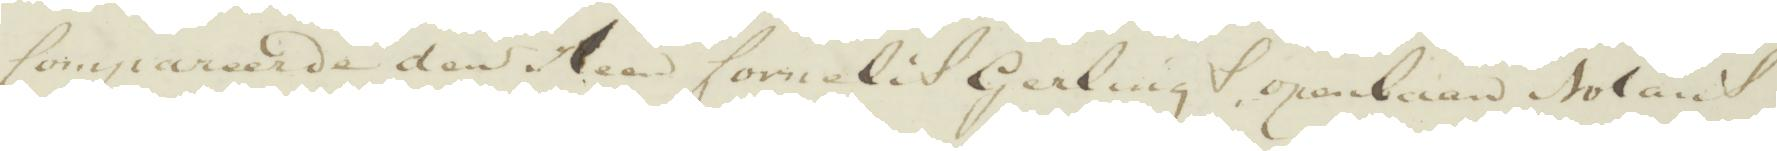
Compareerde den Heer Cornelis Gerlings, openbaar Notaris
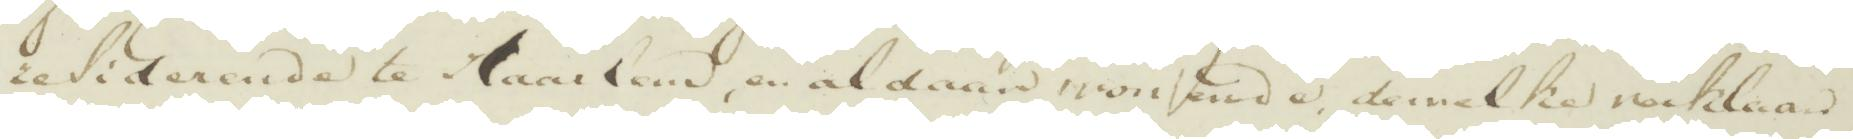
residerende te Haarlem, en aldaar wonende, dewelke verklaar
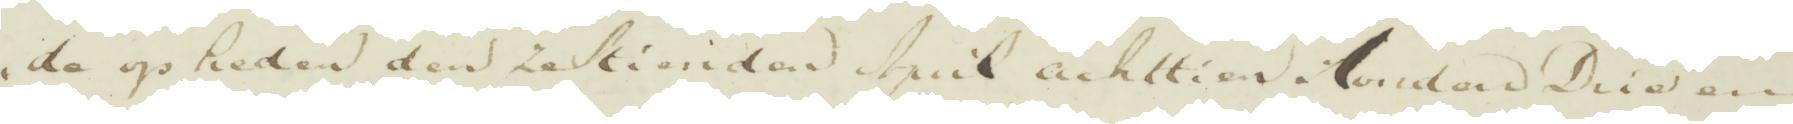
„de op heden den zestienden April achttien Honderd Drie en
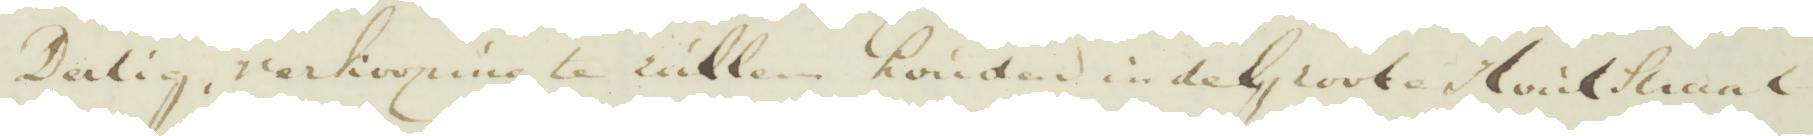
Dertig, verkooping te zullen houden in de Groote Houtstraat
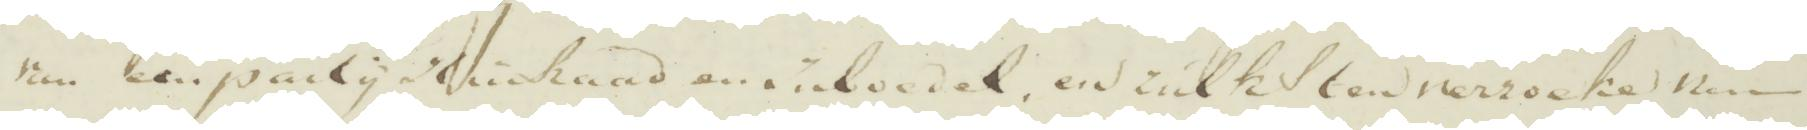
van een partij Huisraad en Inboedel, en zulks ten verzoeke van
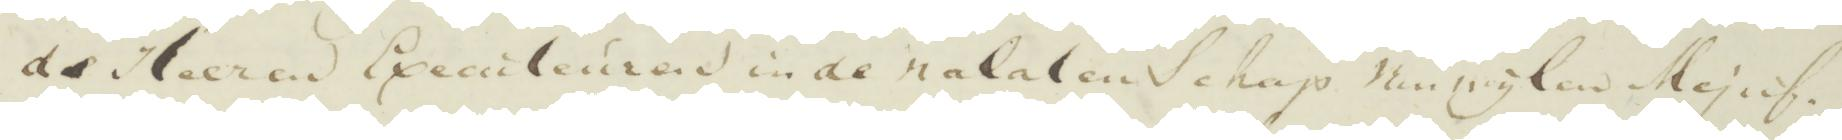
de Heeren Executeuren in de nalatenschap van wijlen Mejuf.
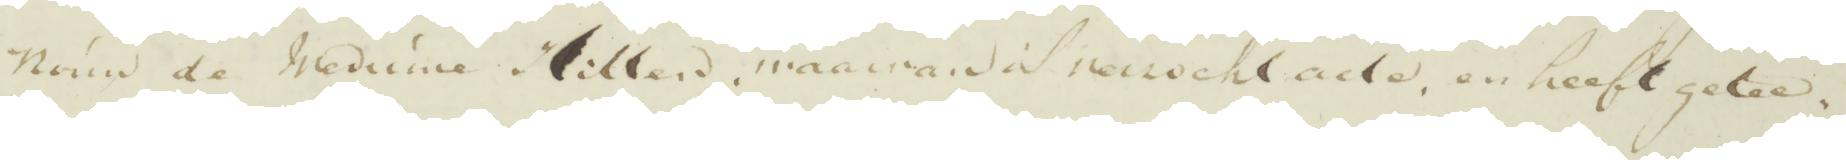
vrouw de weduwe Hillen, waarvan is verzocht acte, en heeft getee„
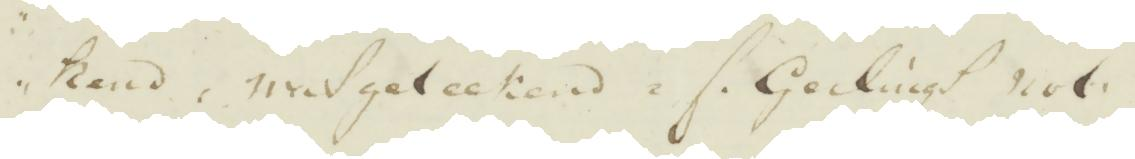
„kend, was geteekend: C. Gerlings not.
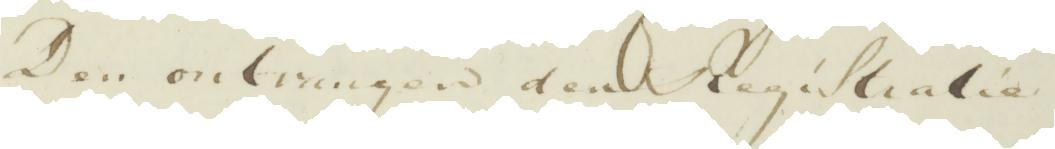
Den ontvanger der Registratie
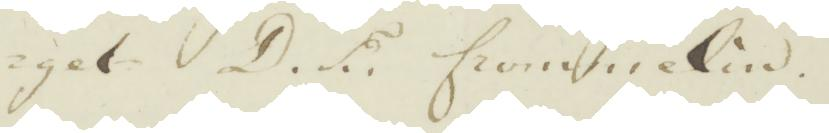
=get: D. F. Crommelin.
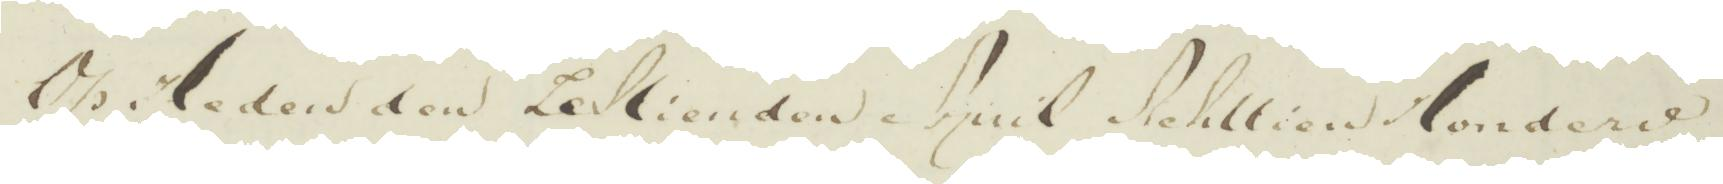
Op Heden den zestienden April Achttien Honderd
